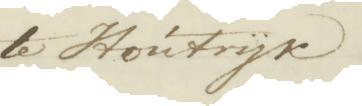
te Houtrijk
